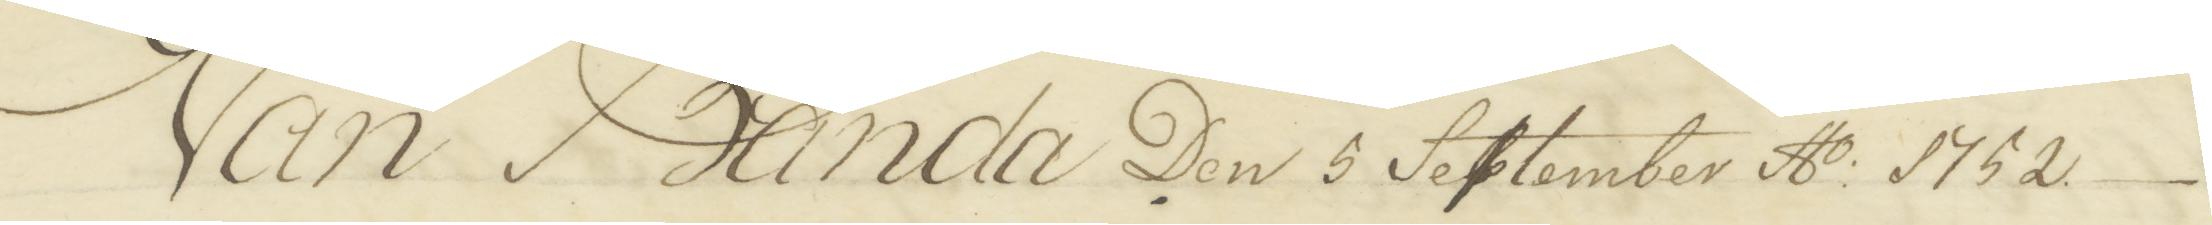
Van Banda Den 5 September A:o 1752: -
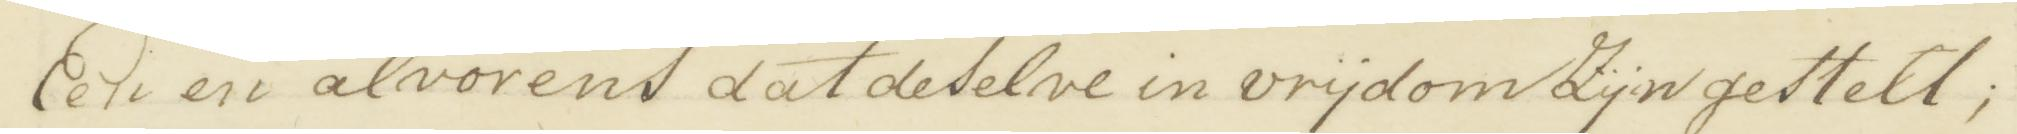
Een en alvorens dat deselve in vrijdom zijn gestelt ;
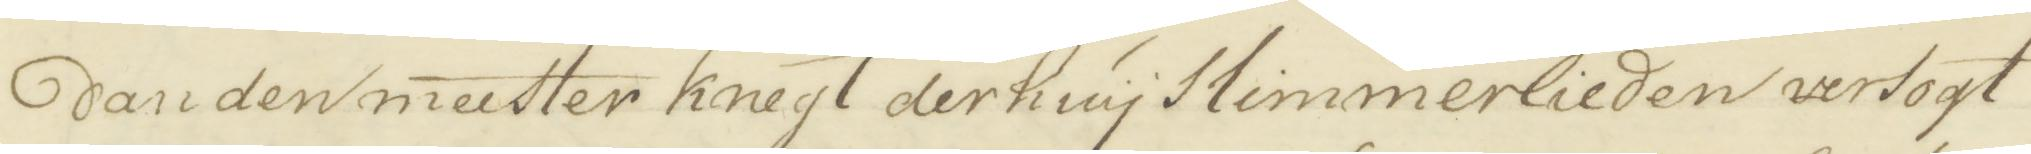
dan den meester knegt der huijstimmerlieden versogt
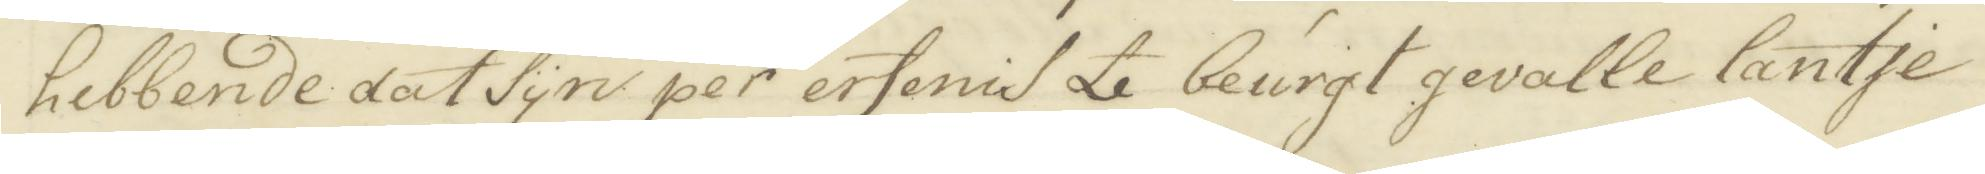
hebbende dat sijn per erfenis te beurgt gevalle lantje
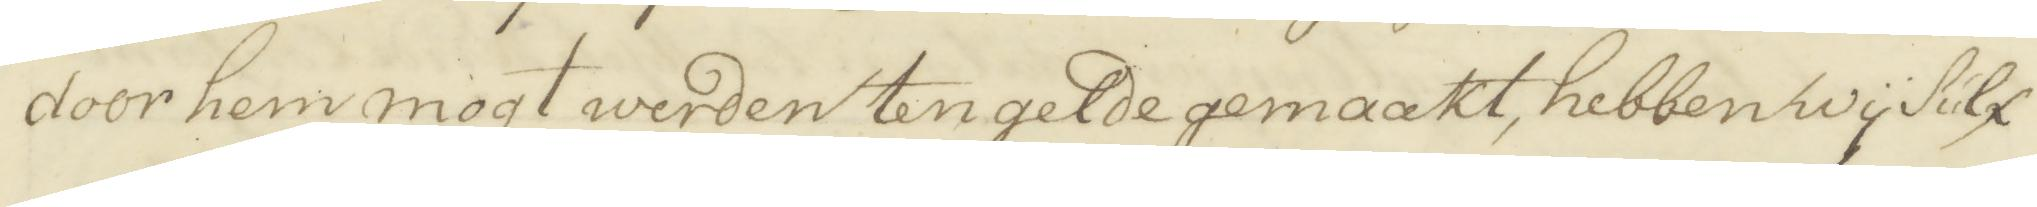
door hem mogt werden ten gelde gemaakt, hebben wij sulx
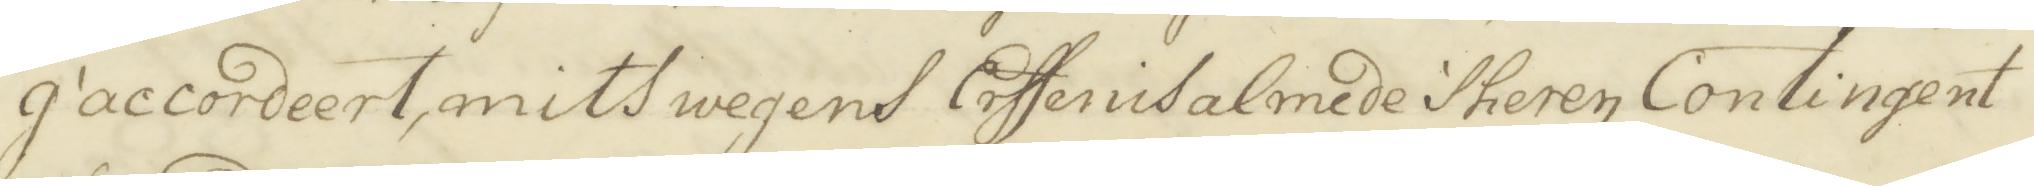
g’accordeert, mits wegens Erffenis almede 'sheren Contingent
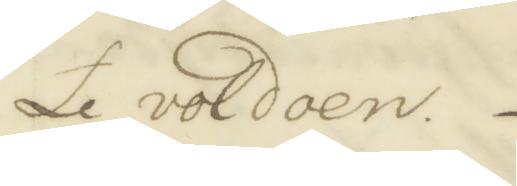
te voldoen. -
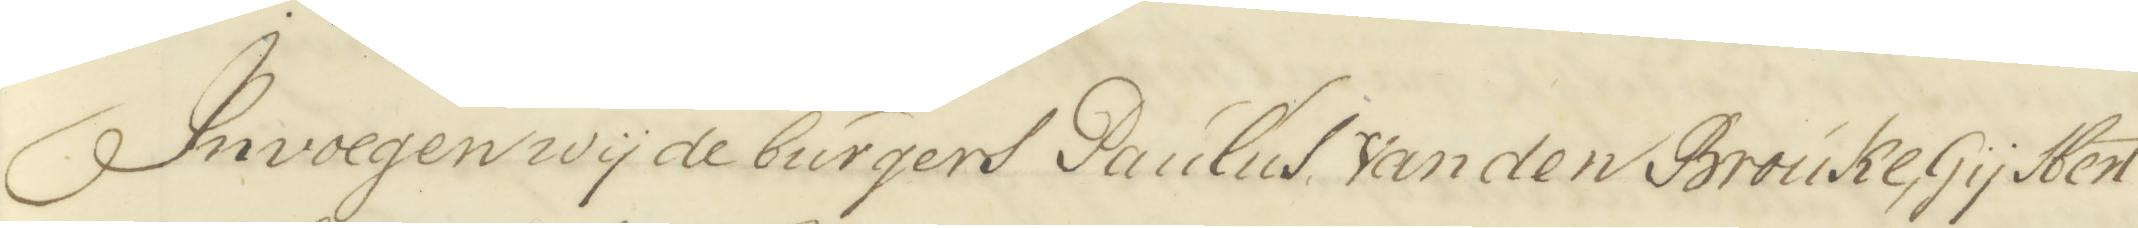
Invoegen wij de burgers Paulus van den Brouke, Gijsbert
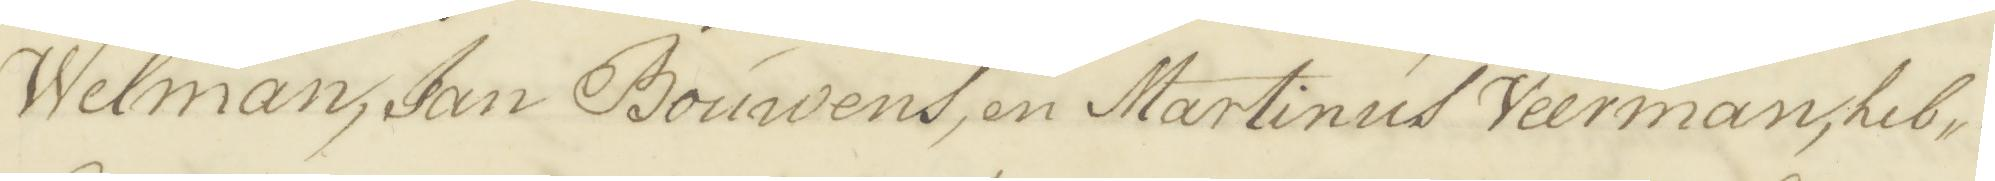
Welman, Ian Bouwens, en Martinus Veerman, heb„
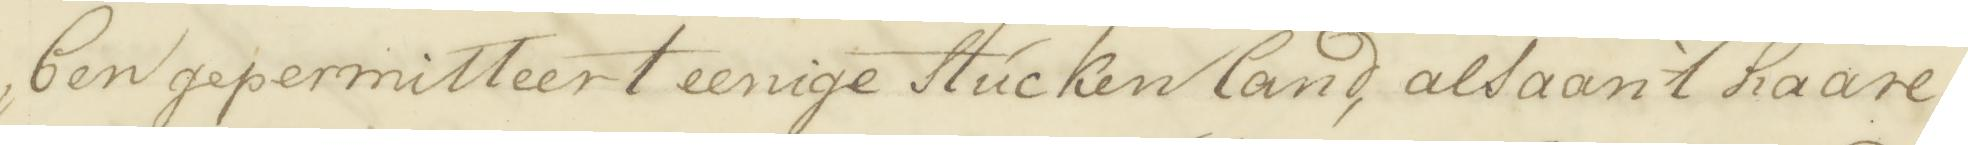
ben gepermitteert eenige stucken land, als aan ’t haare
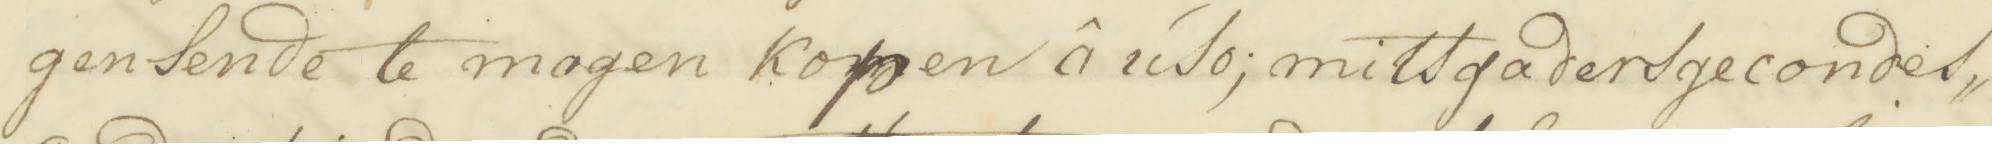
gensende te mogen kopen â uso; mitsgadersgecondes„
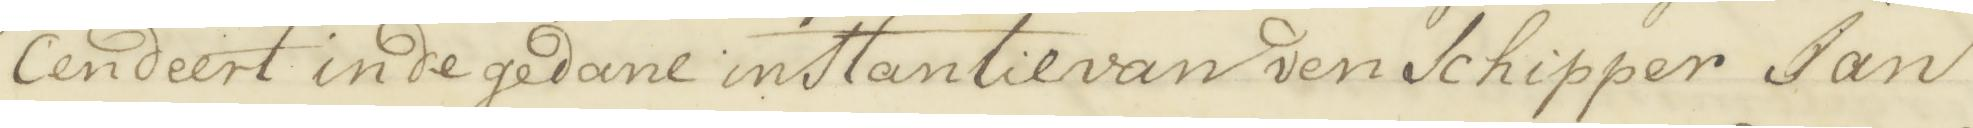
cendeert in de gedane instantie van den schipper Ian
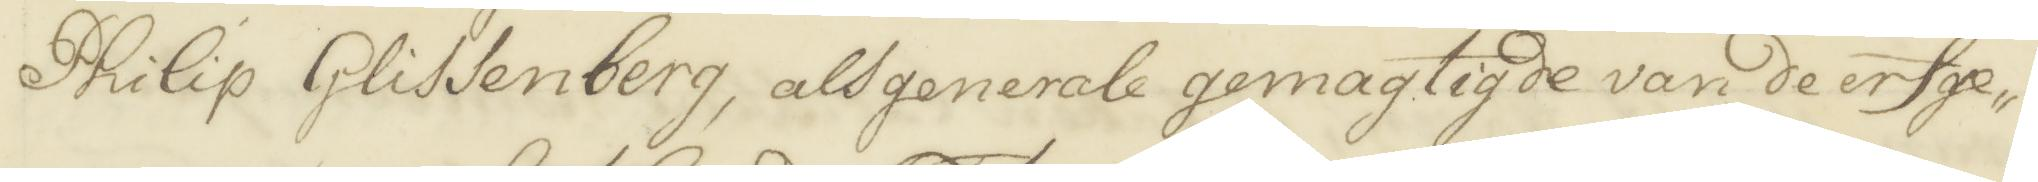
Philip Glissenberg, als generale gemagtigde van de erfge„
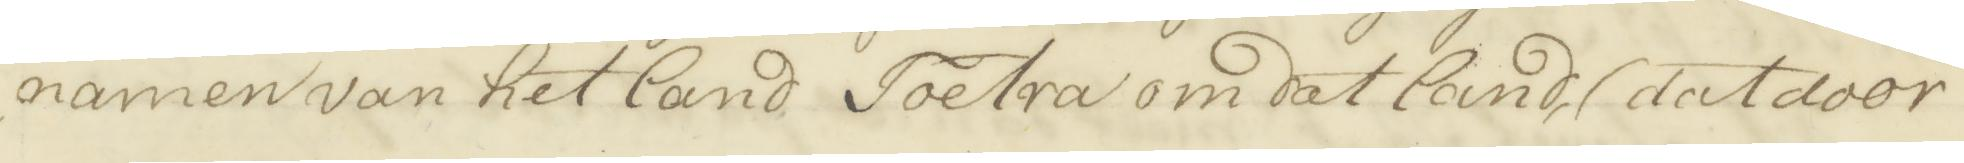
namen van het land Toetra om dat land, (dat door
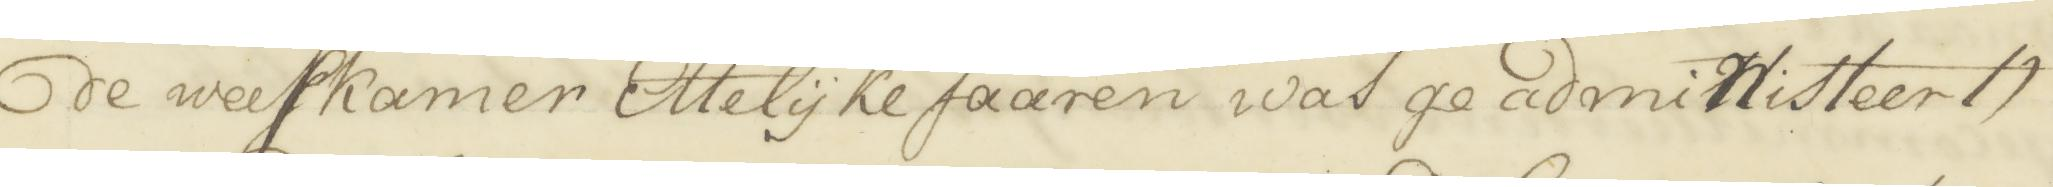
de weeskamer Ettelijke jaaren was geadministeert)
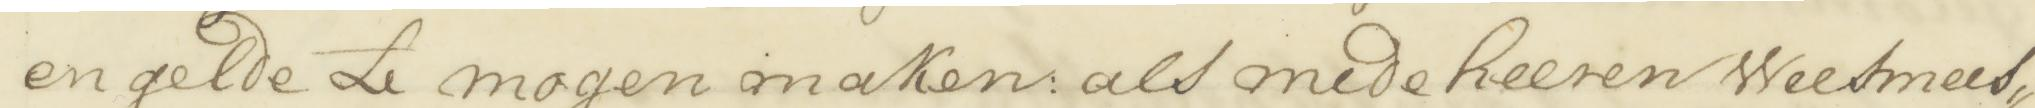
en gelde te mogen maken als mede heeren weesmees„
